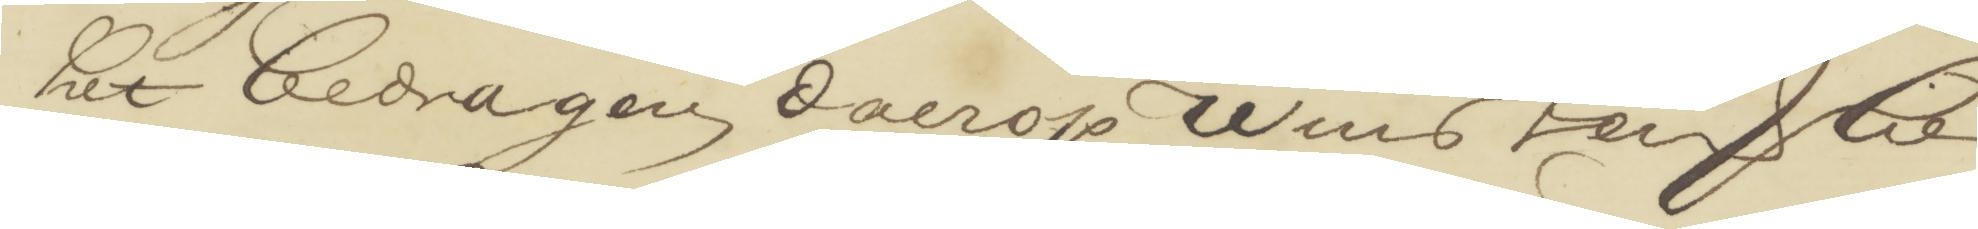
het bedragen daer op winst en verlies
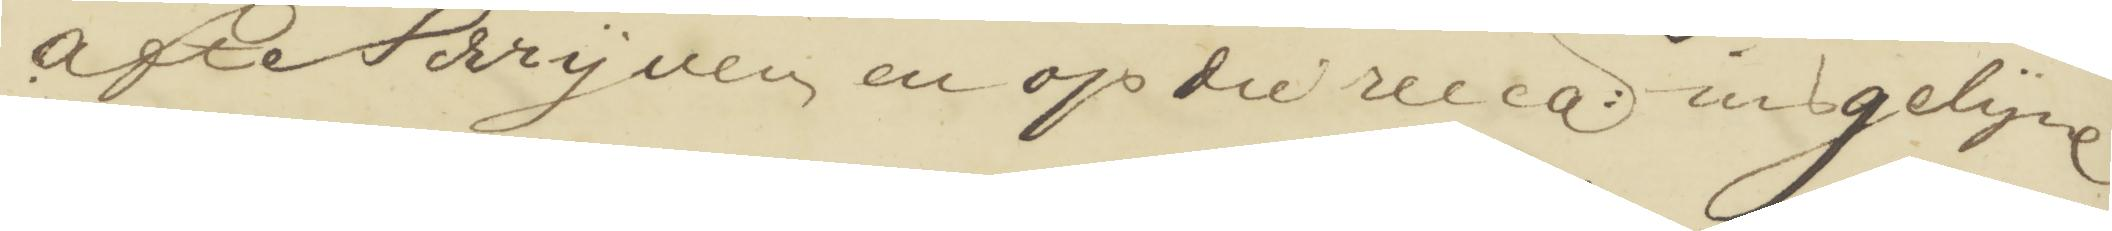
afte Schrijven en op die reecq: ins gelijx
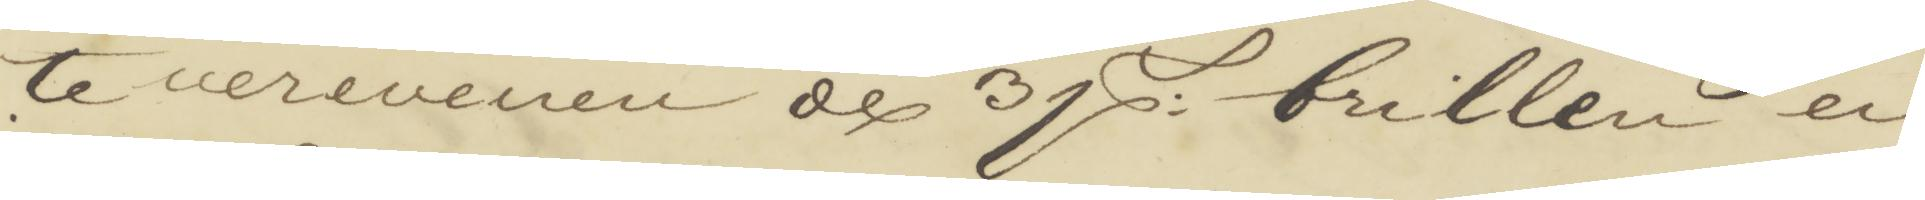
te verevenen de 3 p:s brillen en
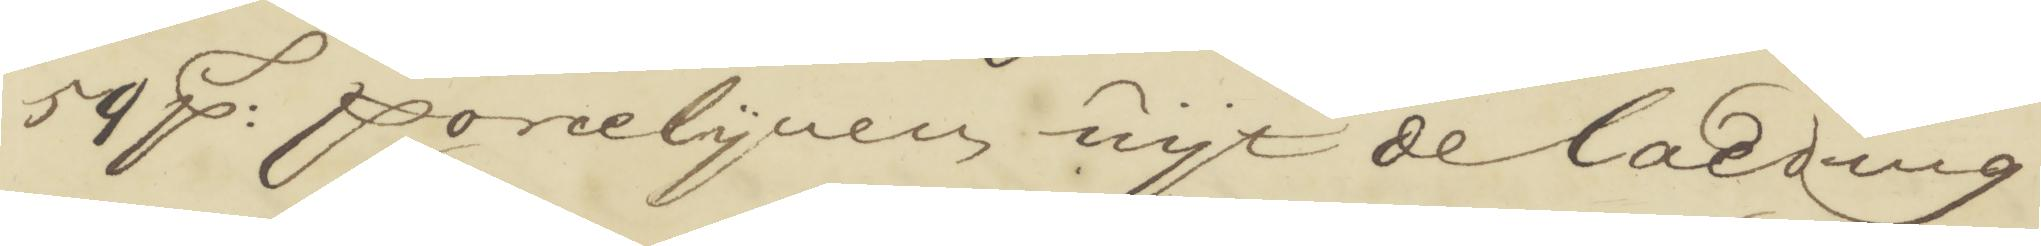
59 p:s porcelijnen uijt de laeding
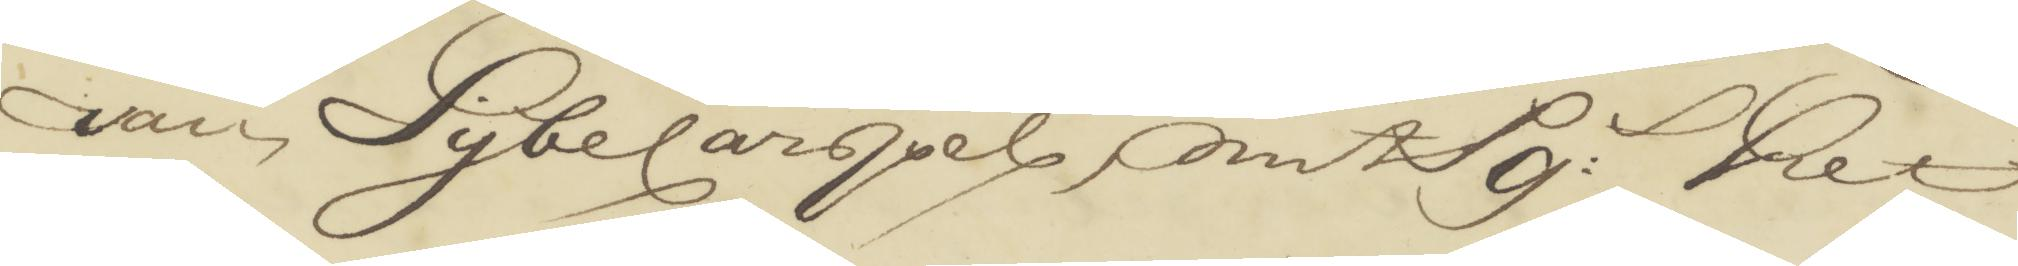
van Sijbecarspel mitsg:s het
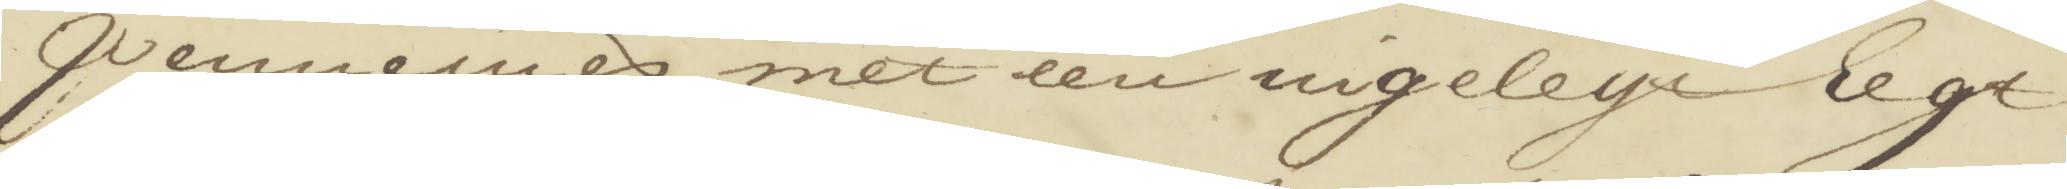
pennemes met een ingelegt hegt
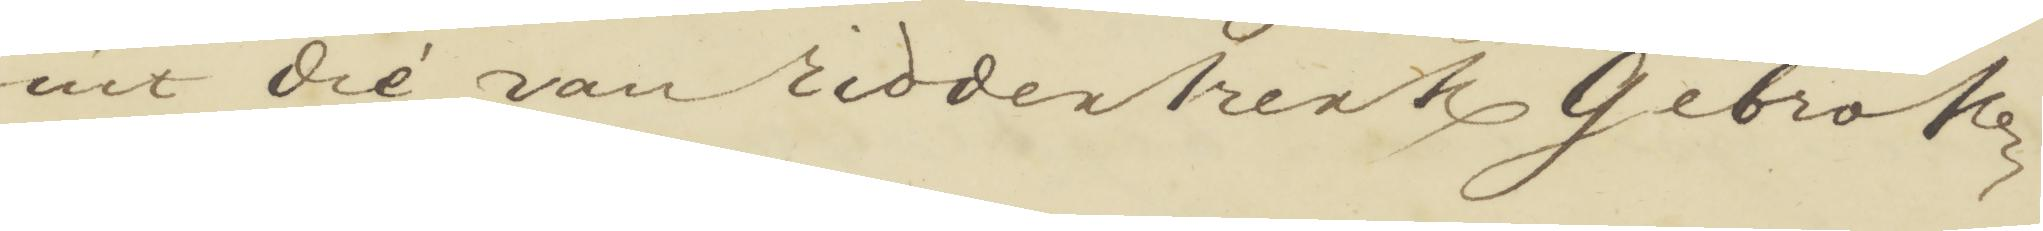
uit die van ridderkerk gebroken
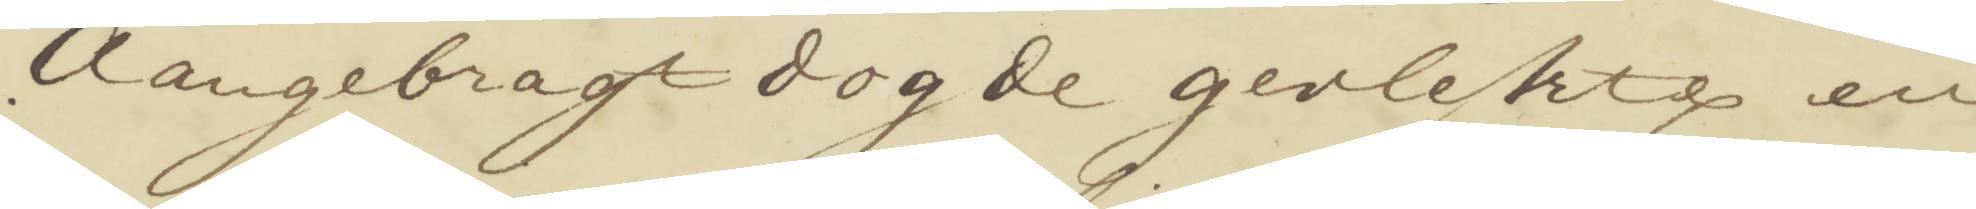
Aangebragt dog de gevlekte en
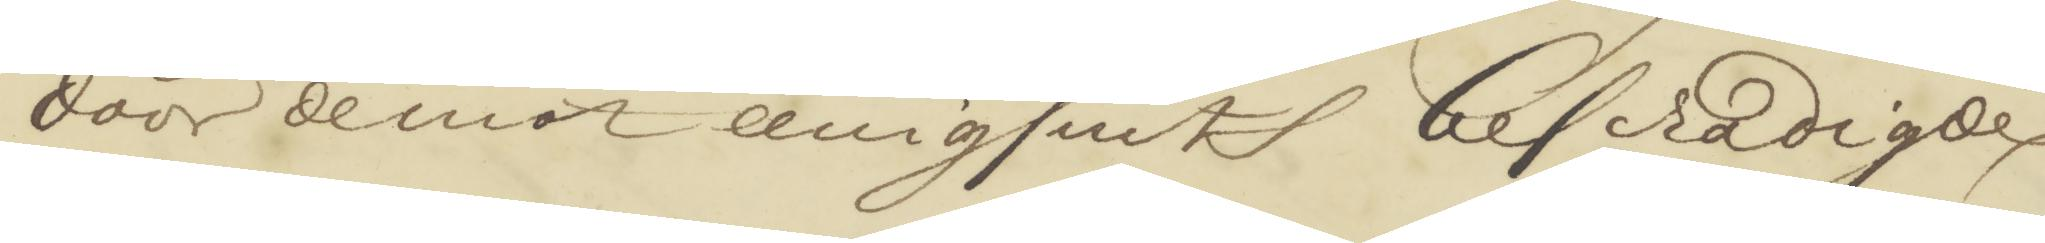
door de mot eenigsints beschadigde
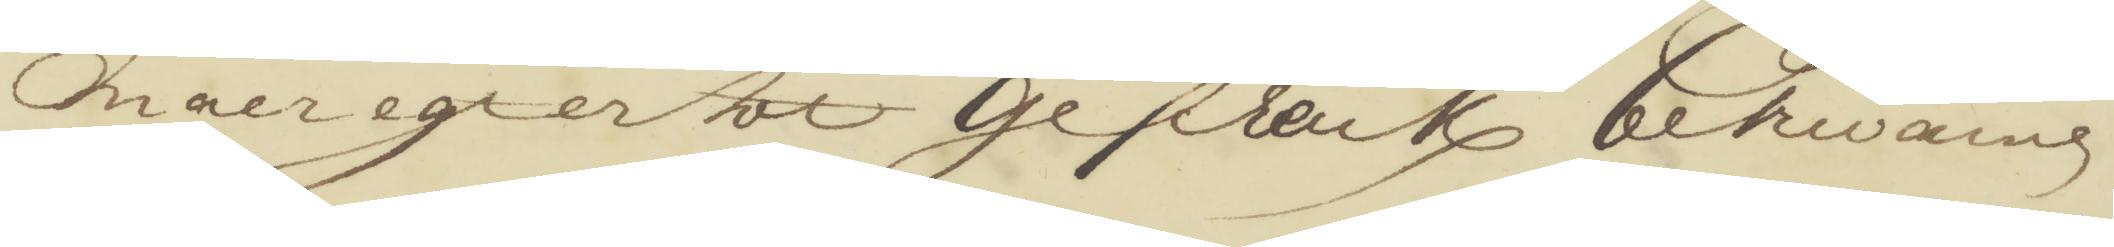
maer egter tot geschenk bekwamen
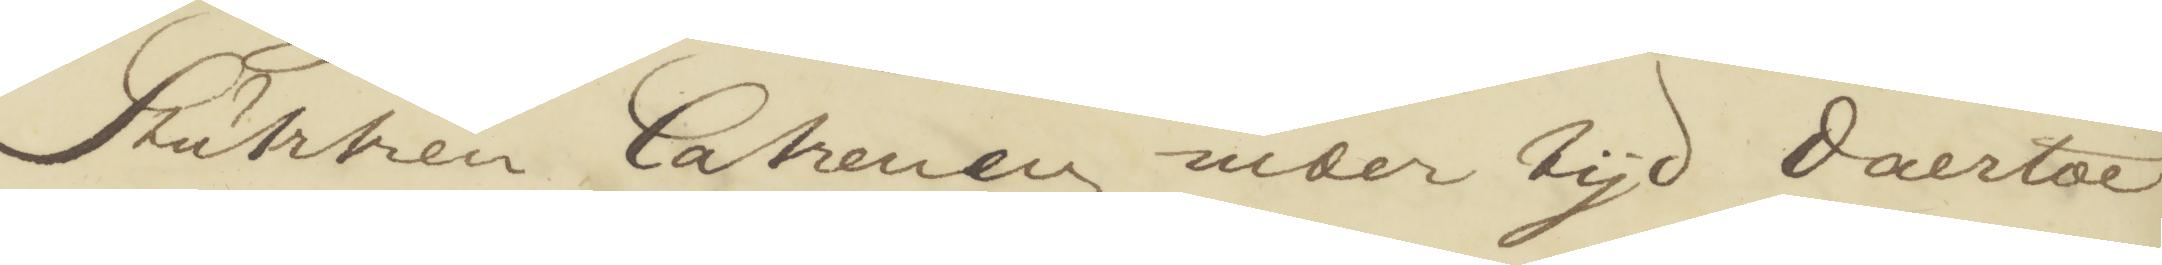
stukken lakenen inder tijd daertoe
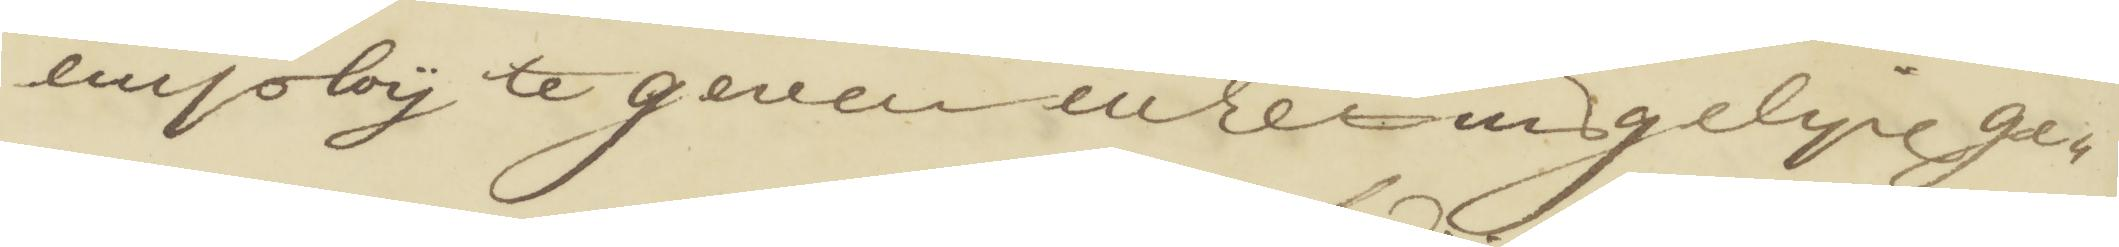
emploij te geven en het in gelijx ge„
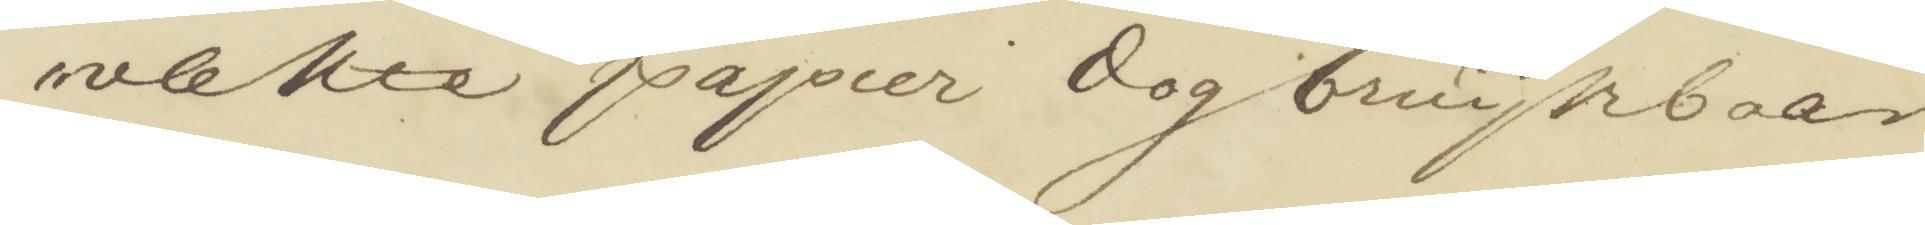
vlekte papier dog bruijkbaar
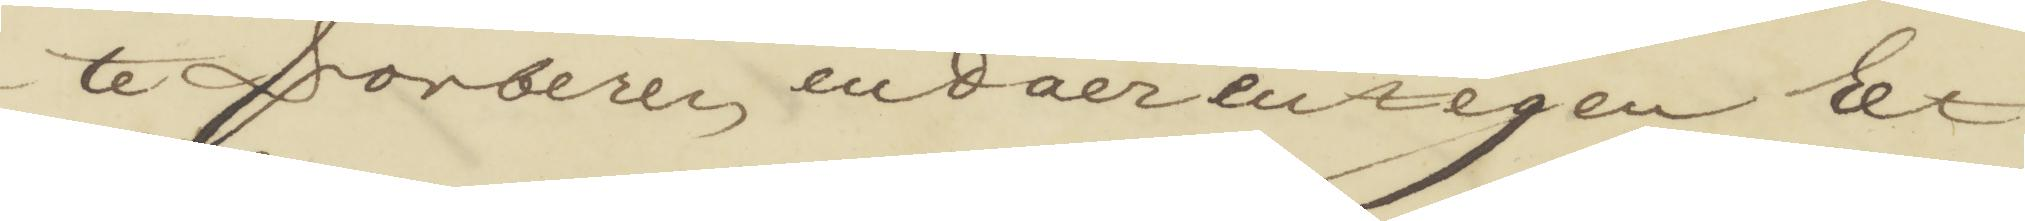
te Verorberen en daer en tegen het
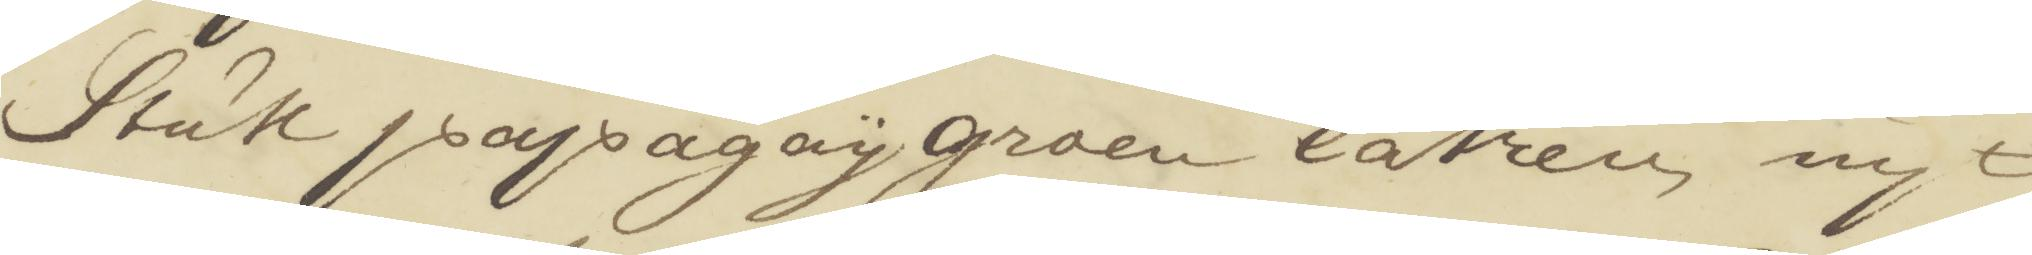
Stuk pappagaij groen laken uijt
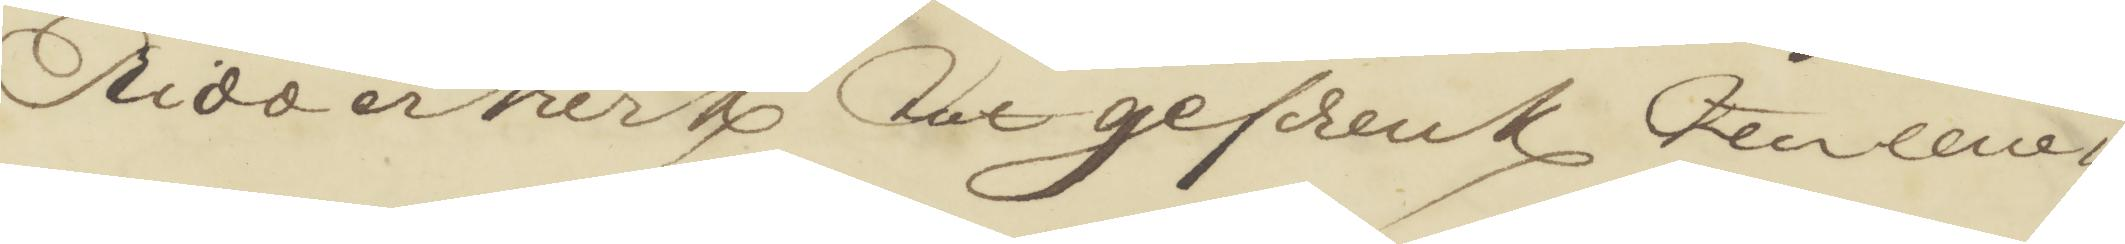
Ridderkerk tot geschenk ten eene
